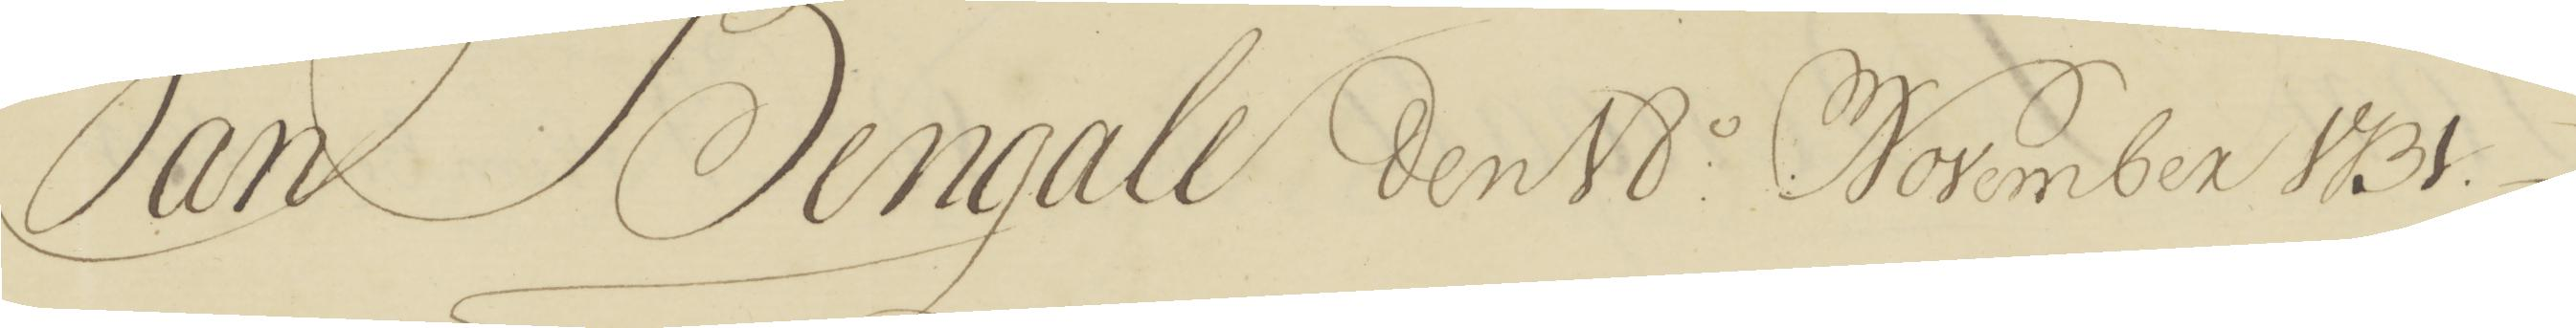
Van Bengale den 18:' November 1731.
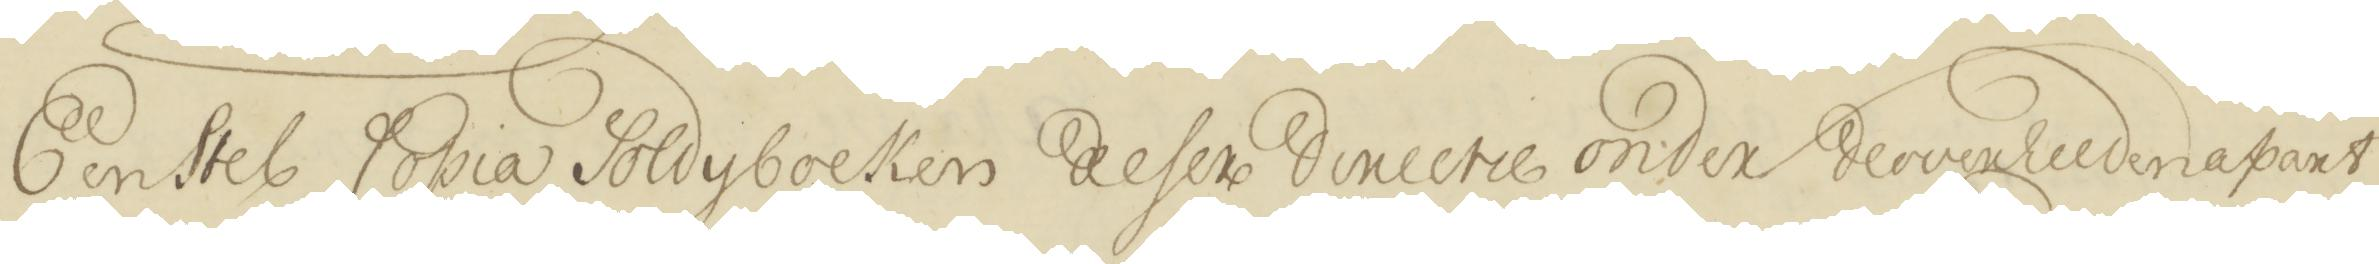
Een stel Copia Soldyboeken deeser directie onder de overheeden apart
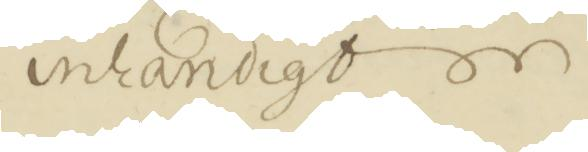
inhandigt
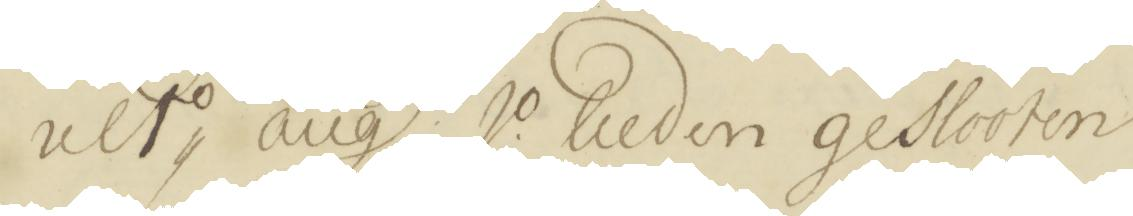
ult„o aug:s j:o leeden geslooten
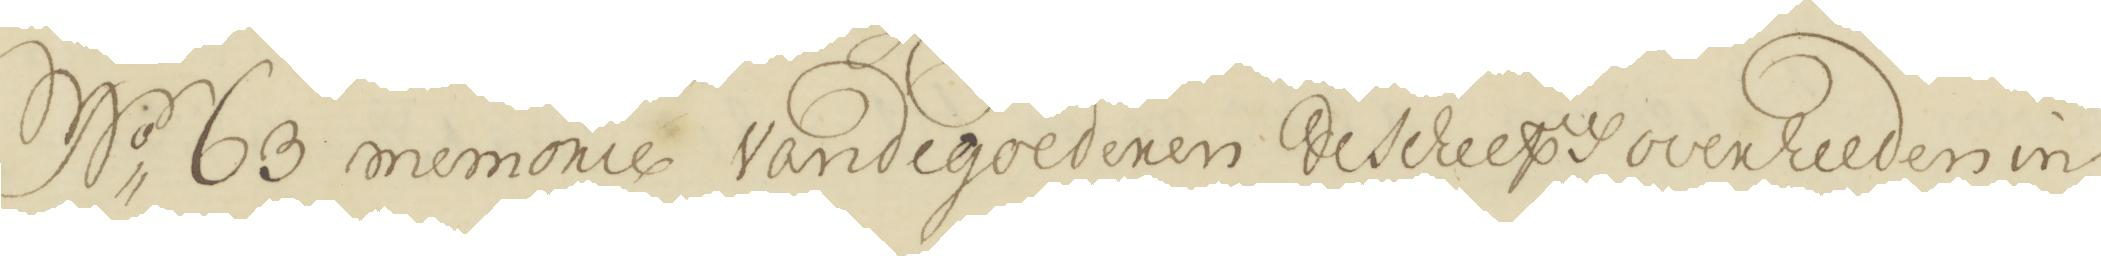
N„o 63 memorie van de goederen de scheeps overheeden in
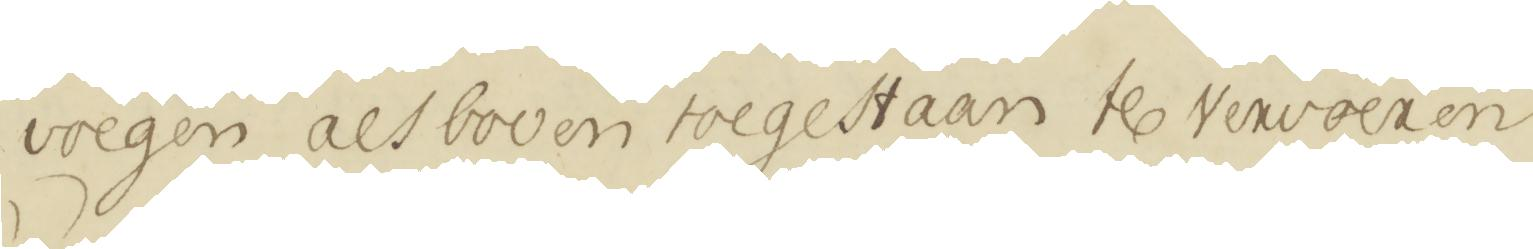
voegen als boven toegestaan te vervoeren
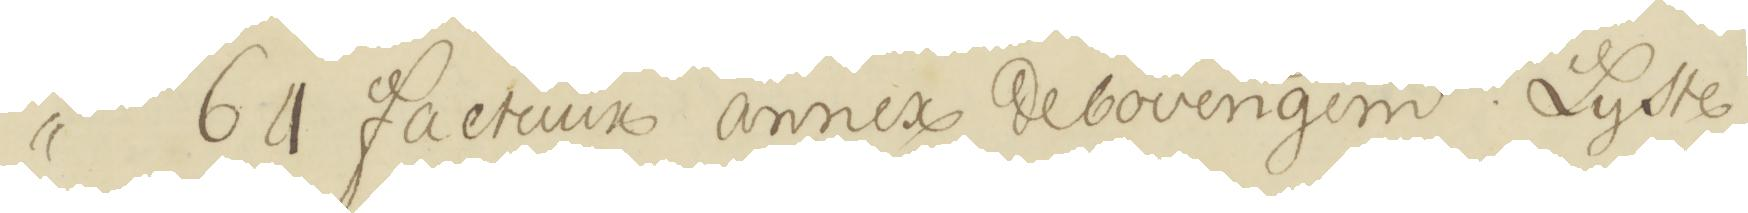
„ 64 factuur annex de bovengem Lyste
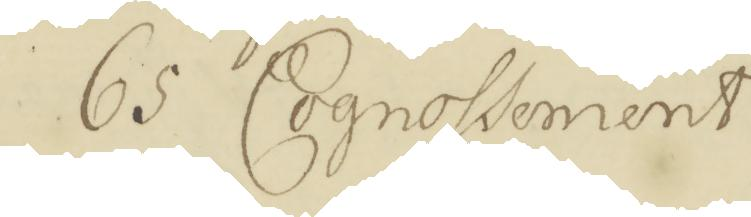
65 Cognossement
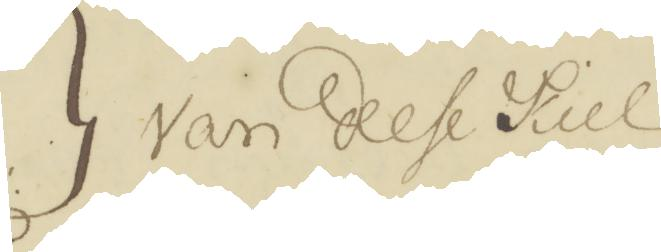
van deese Kiel
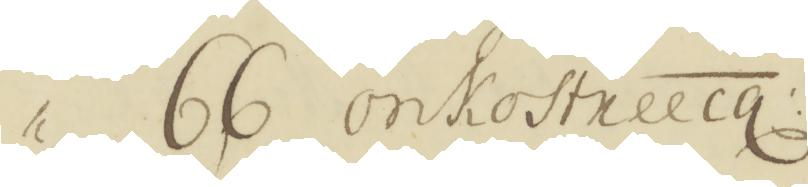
„ 66 onkostreecq
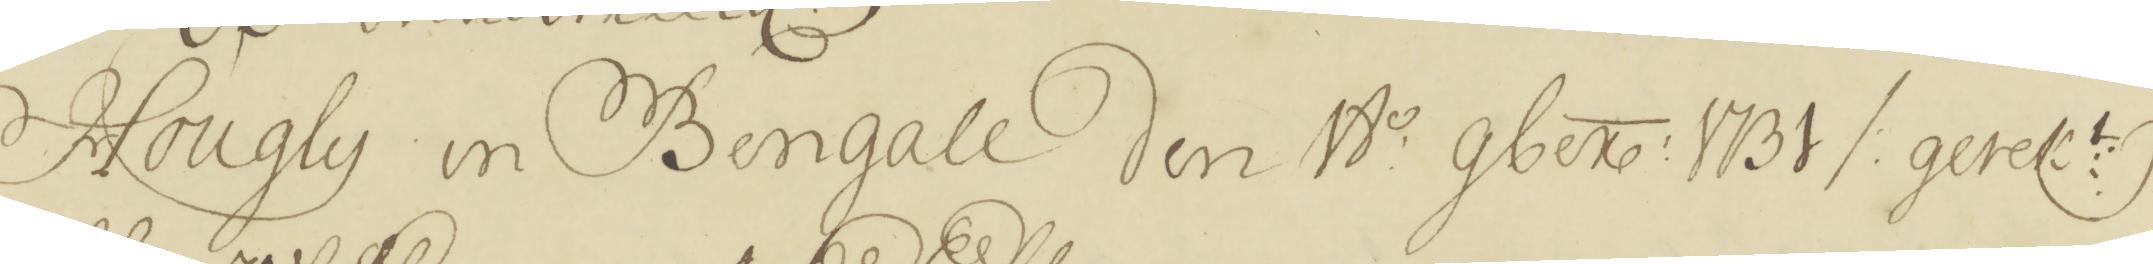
Hougly in Bengale den 18:e 9ber: 1731 /: getek:t :
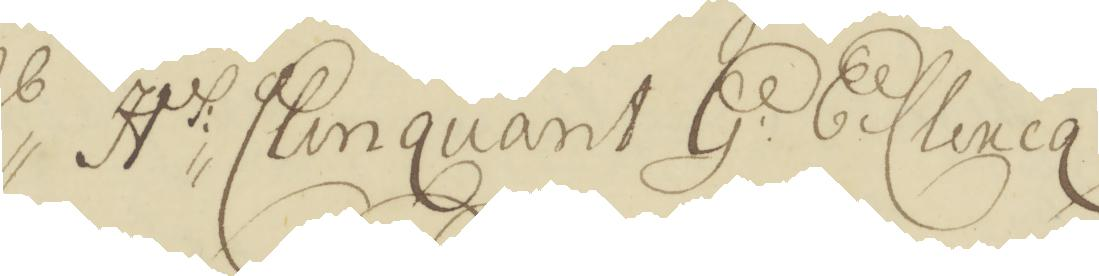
J„b H„s: Clinquant G: E: Clercq
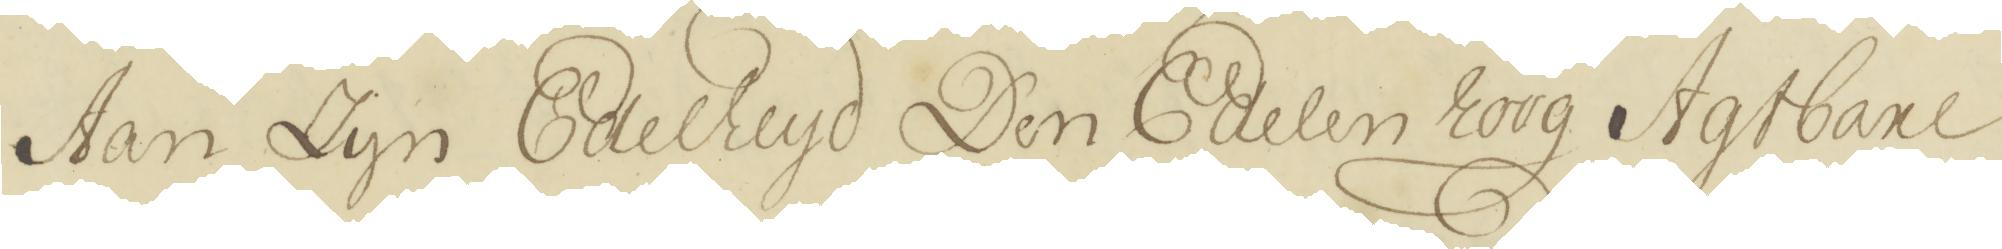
Aan zyn Edelheyd Den Edelen hoog Agtbare
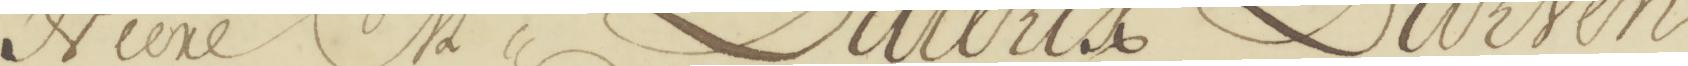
Heere M„r Diderik Durven
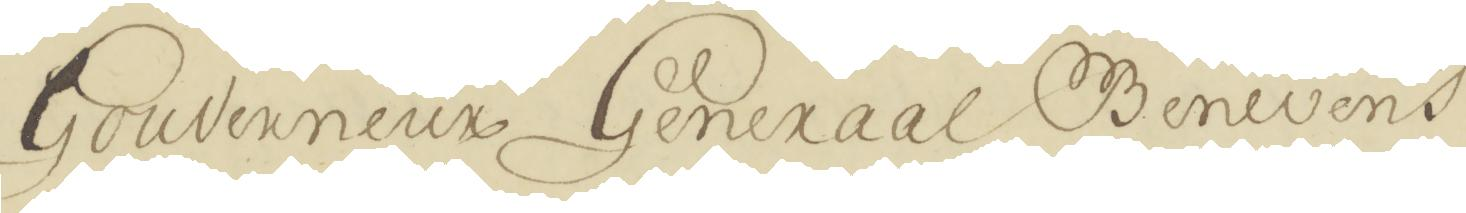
Gouverneur Generaal Benevens
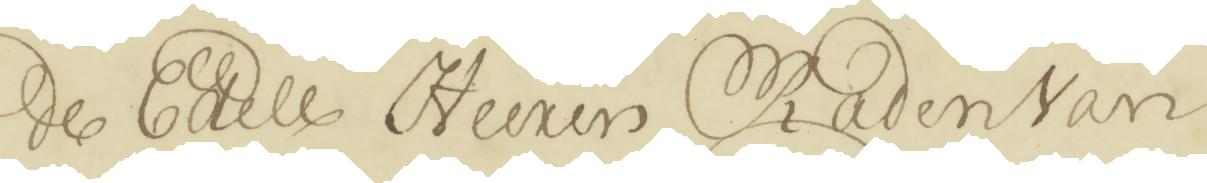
de Edele Heeren Raden van
